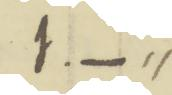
1. – „
